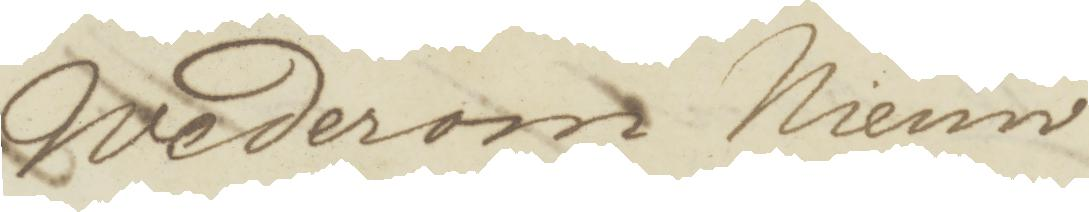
wederom nieuw
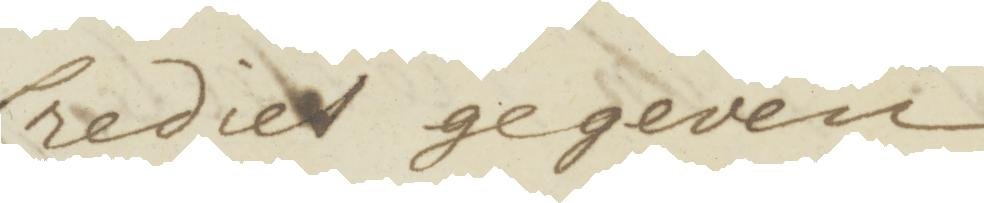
Crediet gegeven
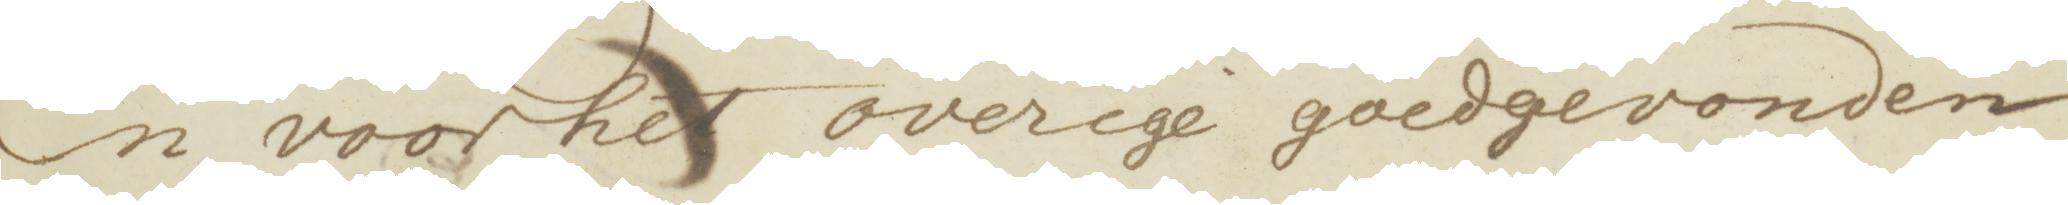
En voor het overige goedgevonden
